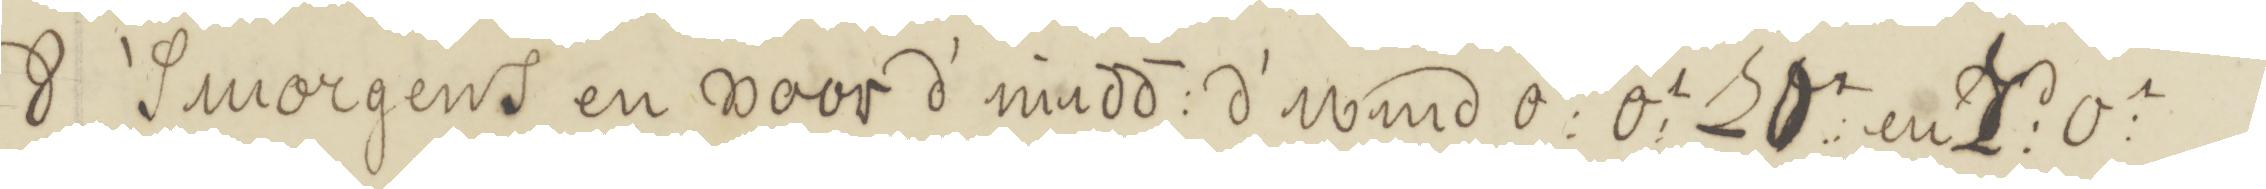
8 's morgens en voor d’ midd: d’ wind O:t O:t ZO:t en Z:d O:t
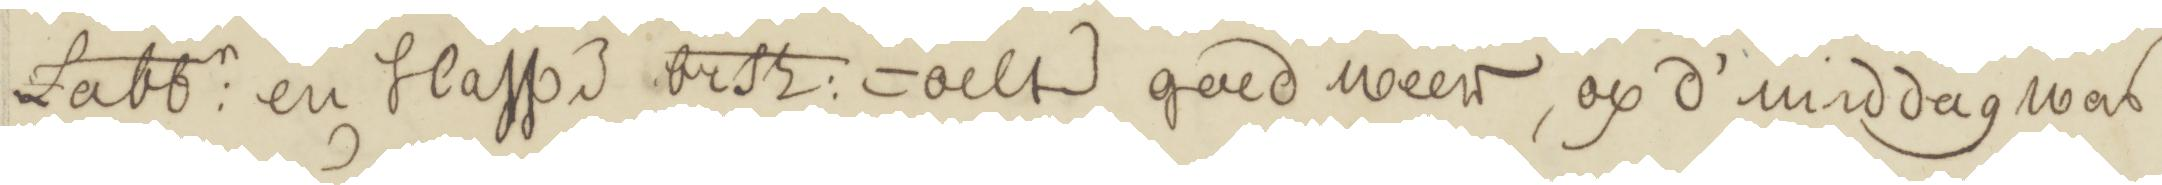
Labb:r en slappe brsz: coelte goed weer, op d’ middag was
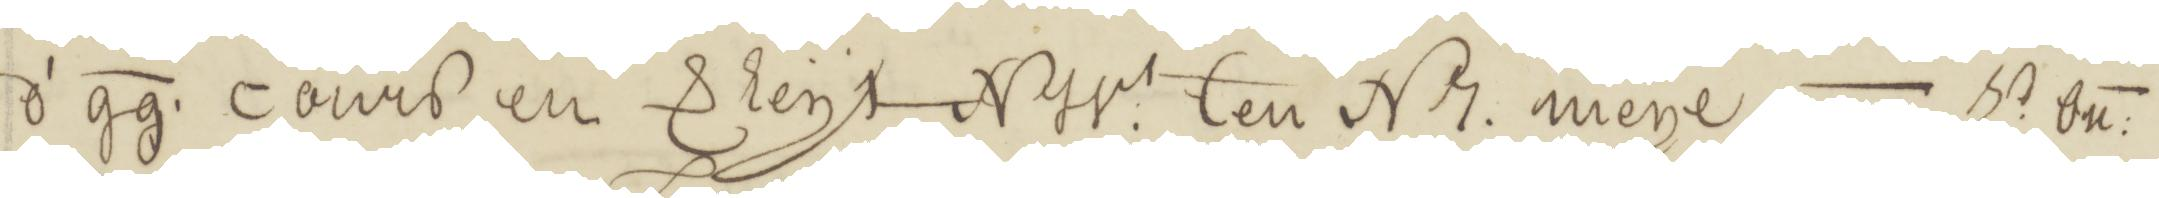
d’ gg: cours en verheijt NW:t ten N 7. meijl gag: Z:d br:
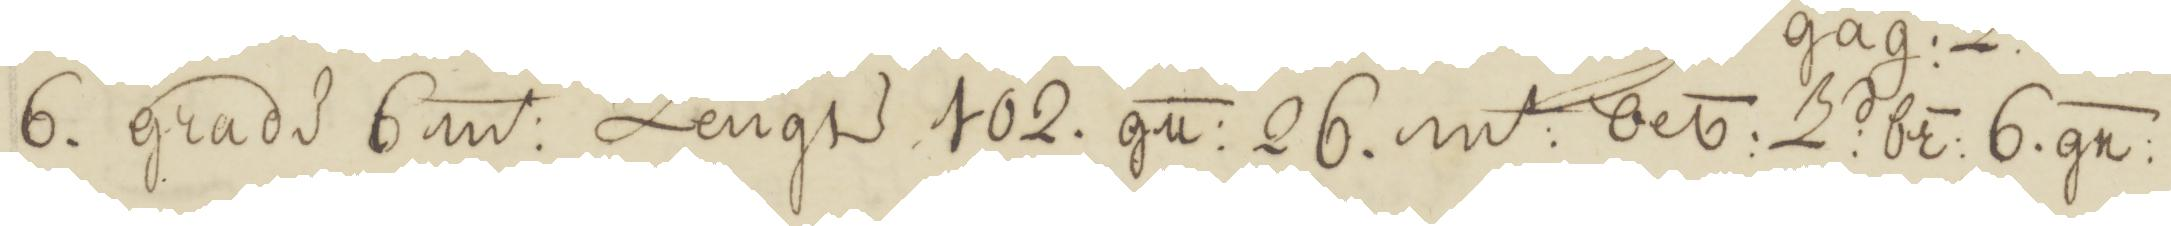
6. grade 6 m:t Lengte 102. gr: 26. m:t bev: Z:d br: 6. gr:
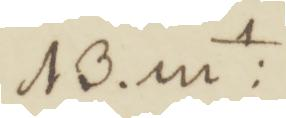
13. m:t
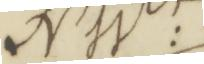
NW:t
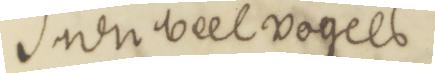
sien veel vogels
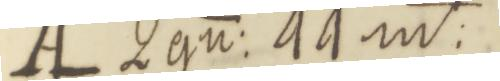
A 2 gr: 44 m:t
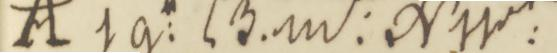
A 1 g:r 53. m:t NW:t
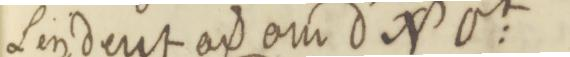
Leijdent over om d’ N O:t
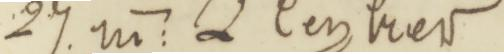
27. m: Z' leijker
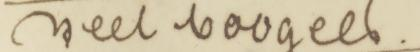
veel voogels
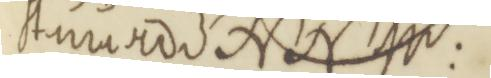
stuurde NNW:t
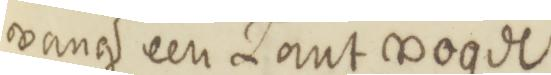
vange een Lant vogel
